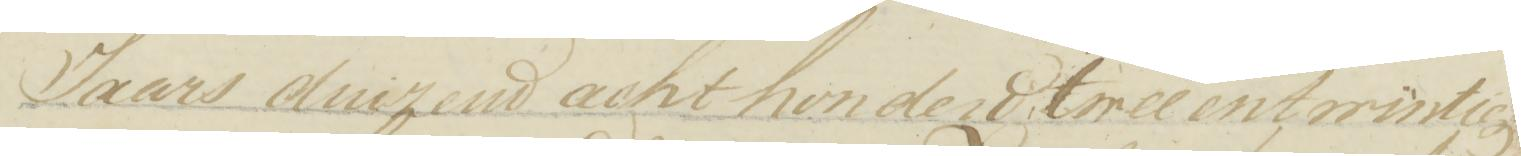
Iaars duizend acht honderd twee entwintig
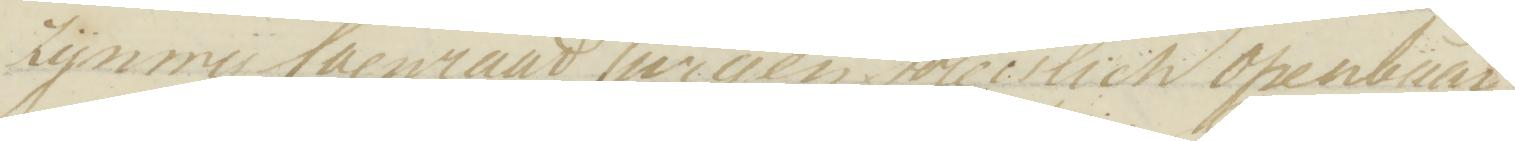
zijn wij Coenraad Jurgen Freitlich openbaar
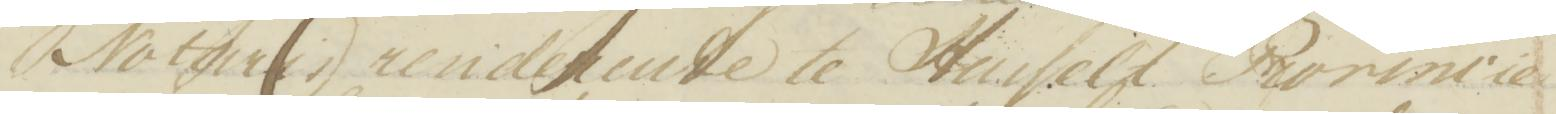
Notaris residerende te Hasself Provincie
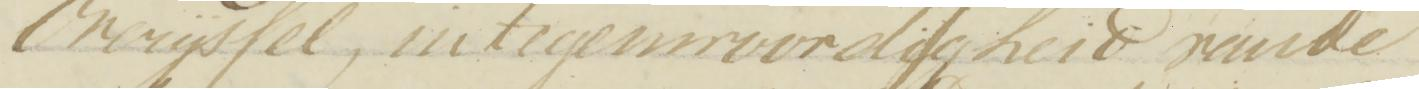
Overijssel, in tegenwoordigheid van de
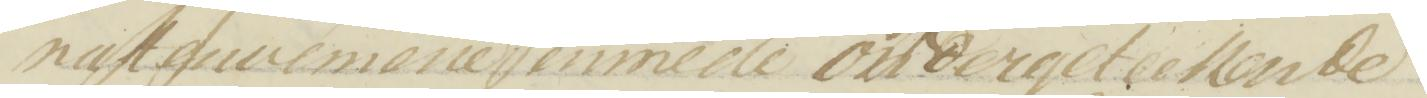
na te noemene en mede ondergeteekende
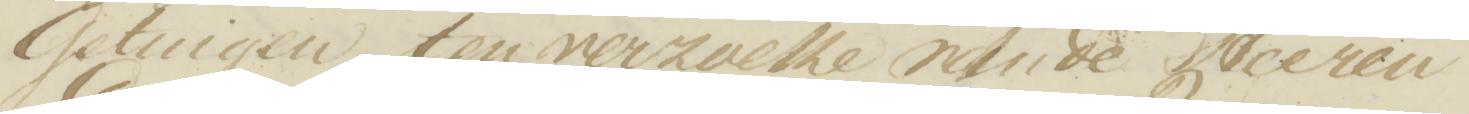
Getuigen ten verzoeke van de Heeren
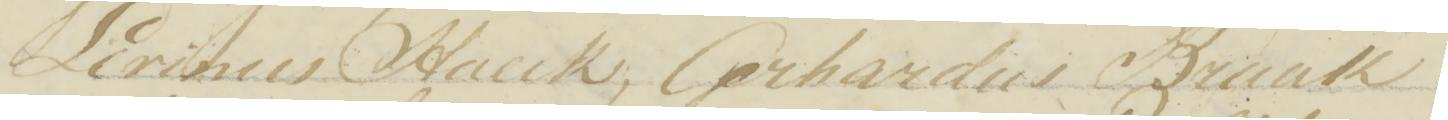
Levinus Haeck Gerhardus Braak
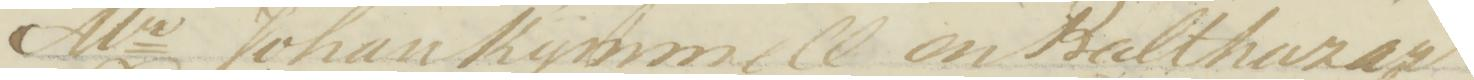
M=r Johan Kijmmell en Balthazar
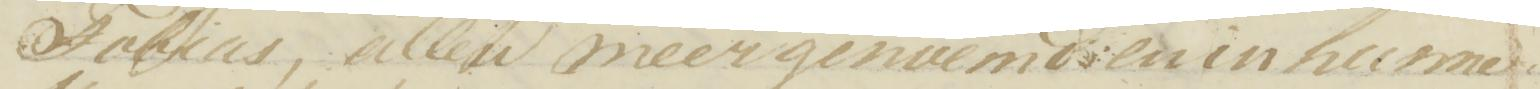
Tobias, allen meer genoemd en in hunne
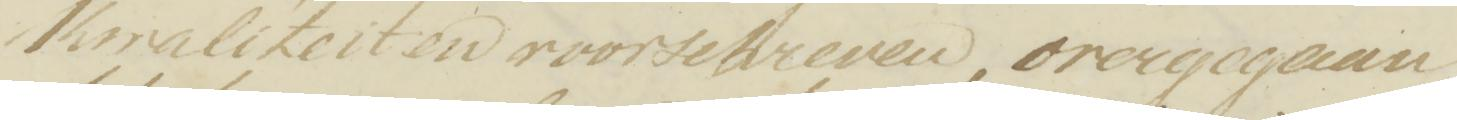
Kwaliteit en voorschreven overgegaan
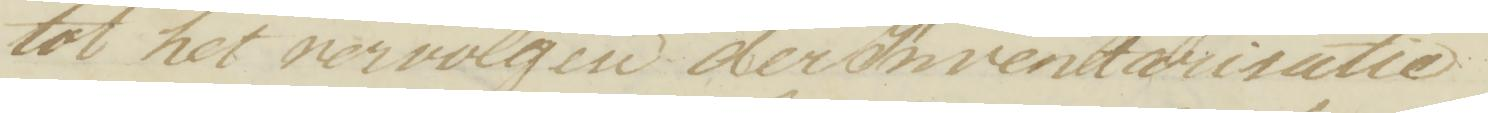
tot het vervolgen der Inventarisatie
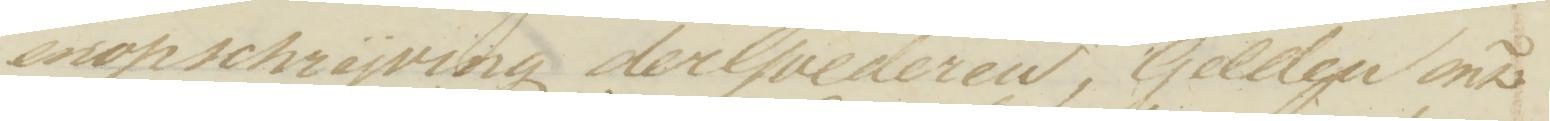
en opschrijving der Goederen, Gelden enz:
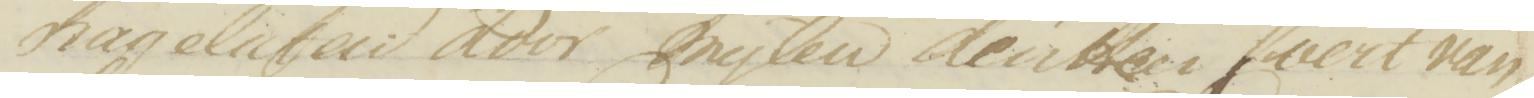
nagelaten door wijlen den Heer Coert van
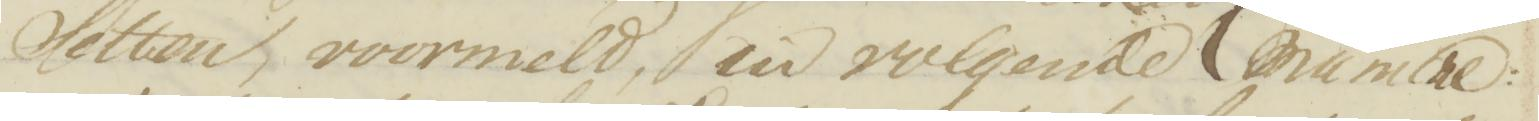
Setten voormeld, in volgende maniere:
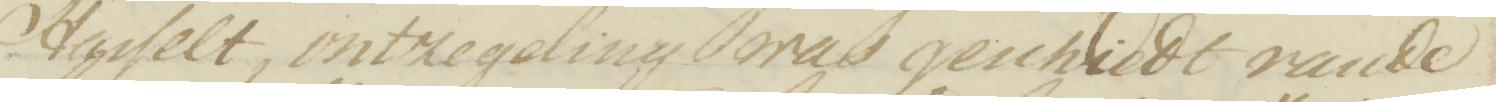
Hasselt, ontzegeling was geschiedt vande
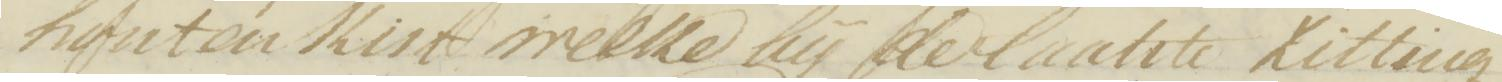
houten Kist welke bij de laatste Zitting
